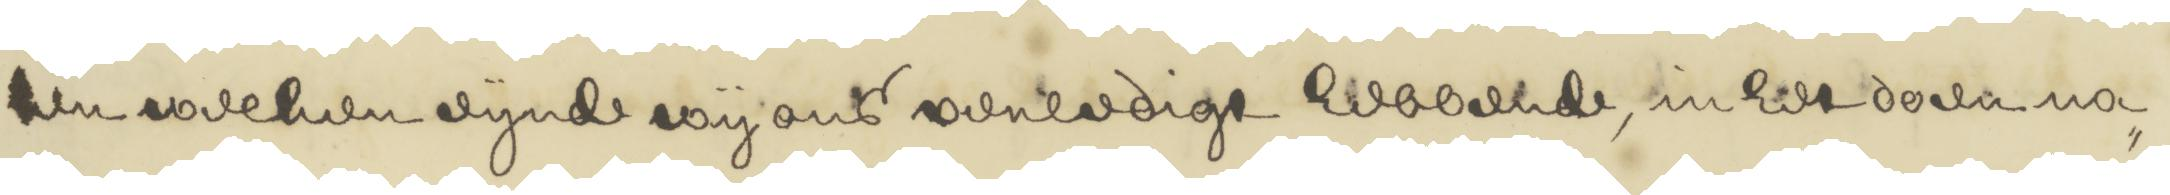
ten welken eijnde wij ons verledigt hebbende, in het doen na„
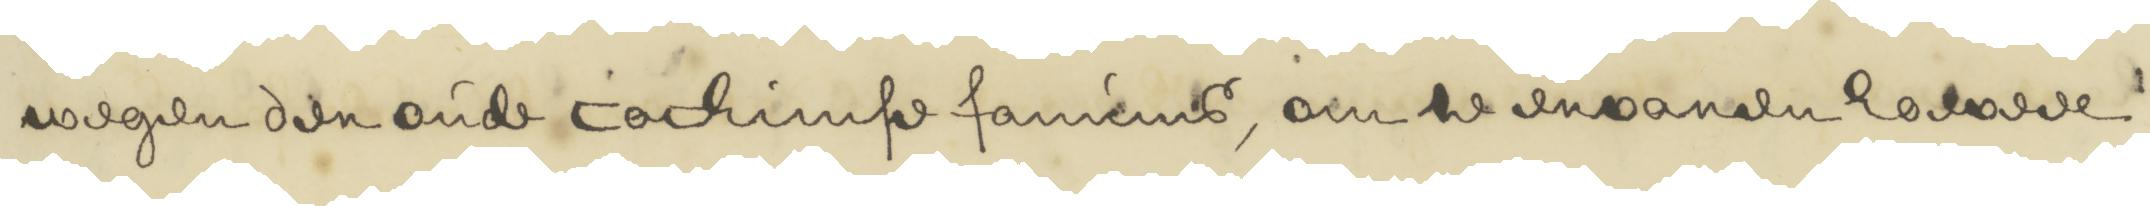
wegen der oude cochimse fanums, om te ervanen hoeveel
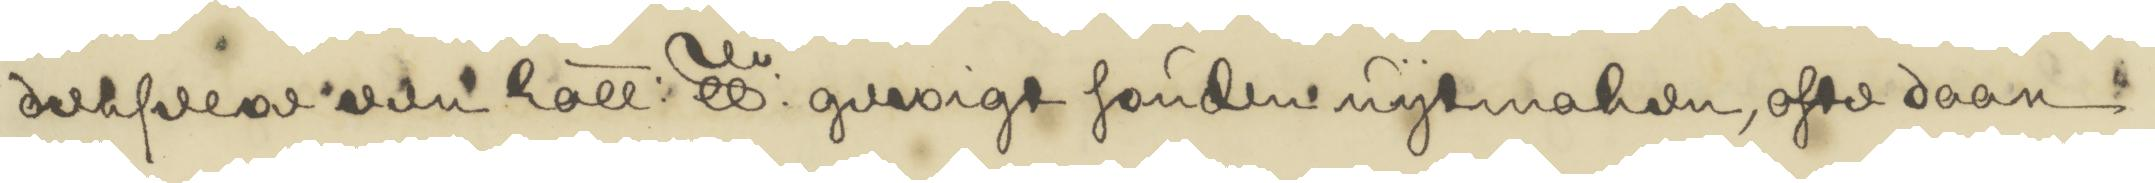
derselve een holl: lb: gewigt souden uijtmaken, ofte daar
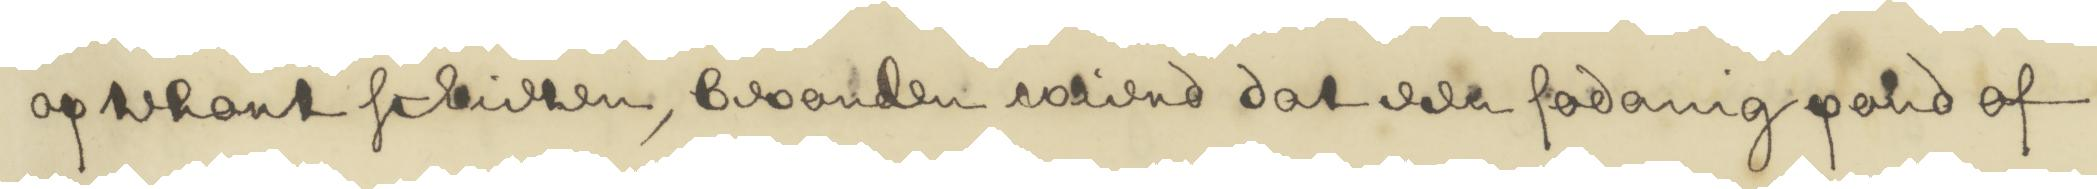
op tekort schieten, bevonden wierd dat een sodanig pond of
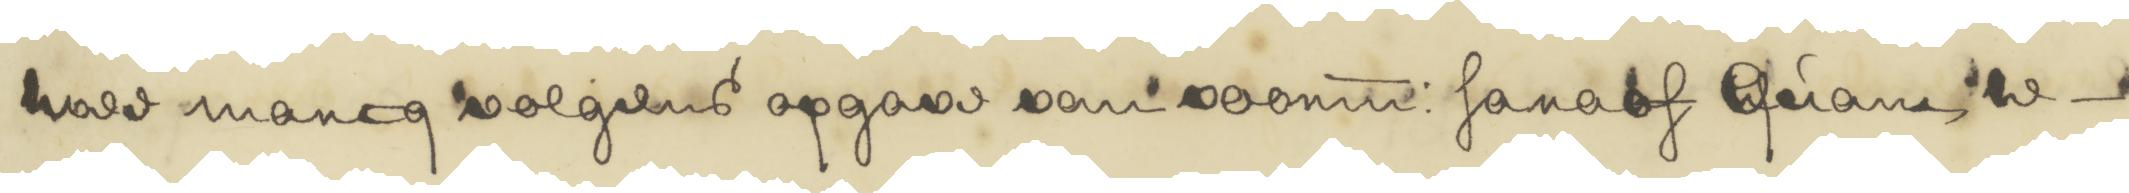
twee mancq volgens opgave van voorm: saraaf quam te —
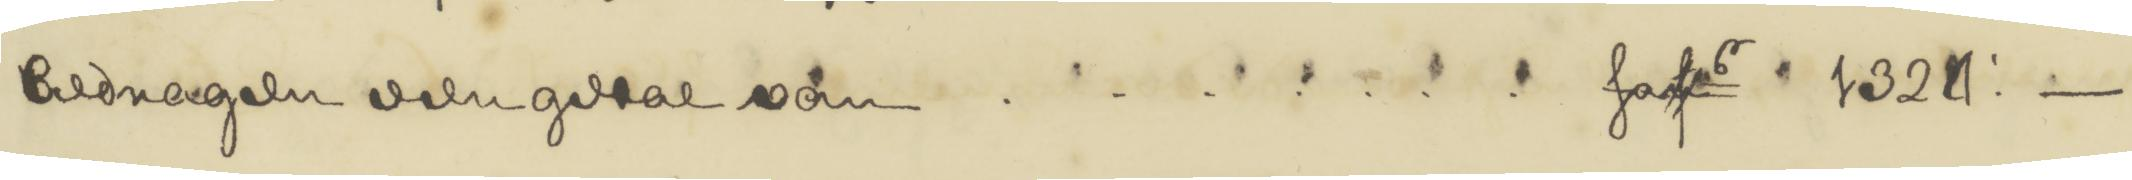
bedragen een getal van . . . . . . . fan=s 1324: —
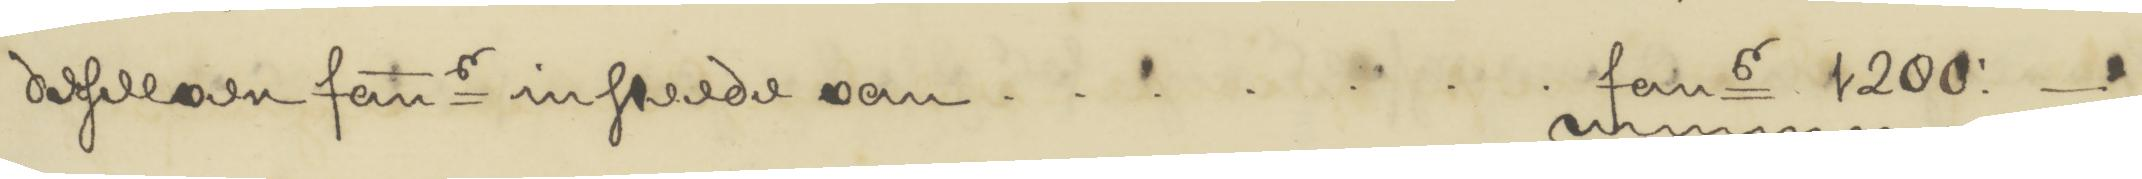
deselven fan=s in steede van . . . . . . . fan=s 1288: —
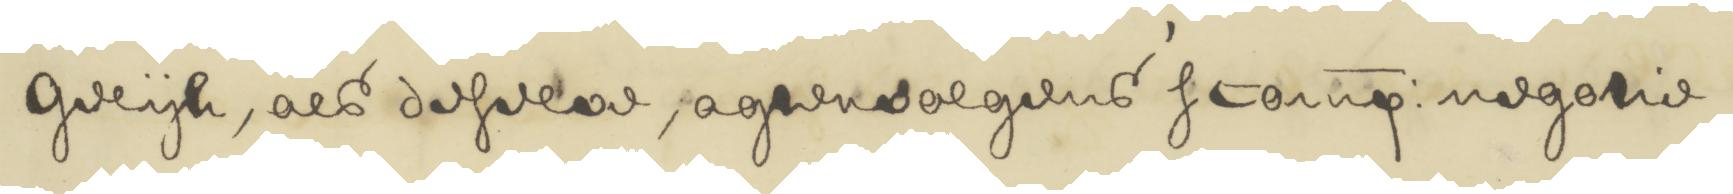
gelijk, als deselve, agtervolgens 's comp: negotie
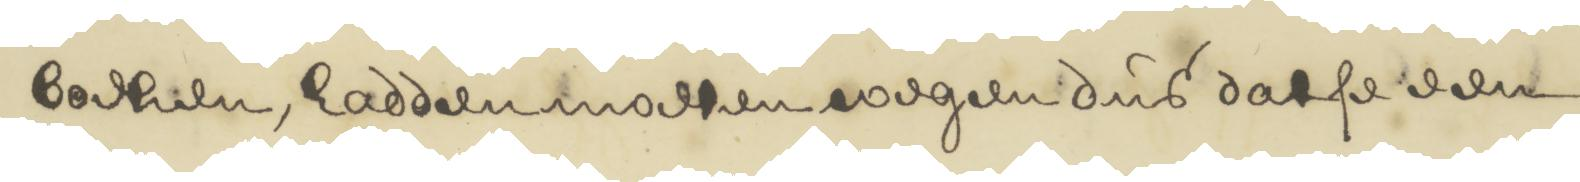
boeken, hadden moeten wegen dus datse een
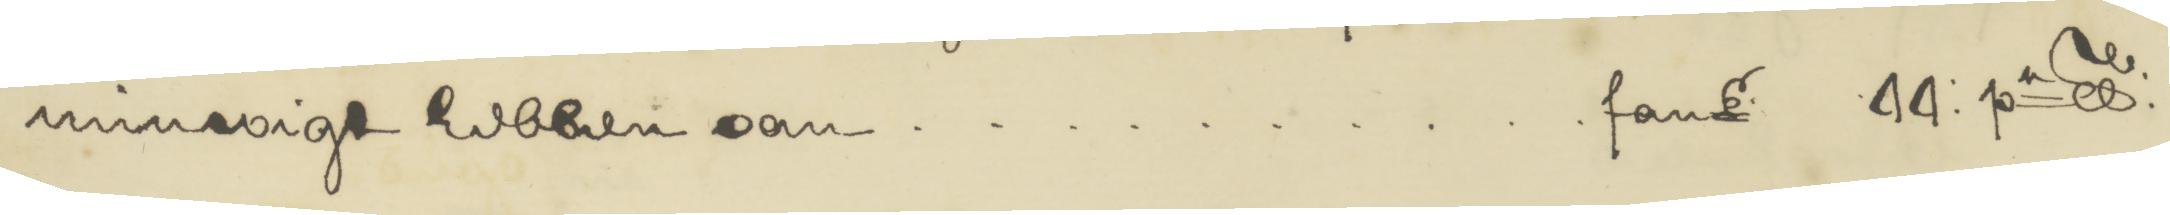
minwigt hebben van . . . . . . . . . . fan=s 44: p=r lb:
